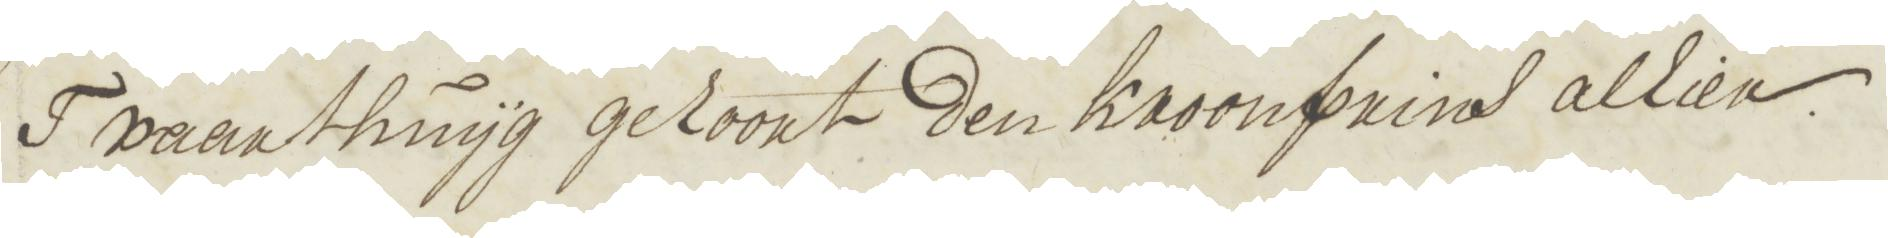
T vaarthuijg gehoort den kroonprins alhier.
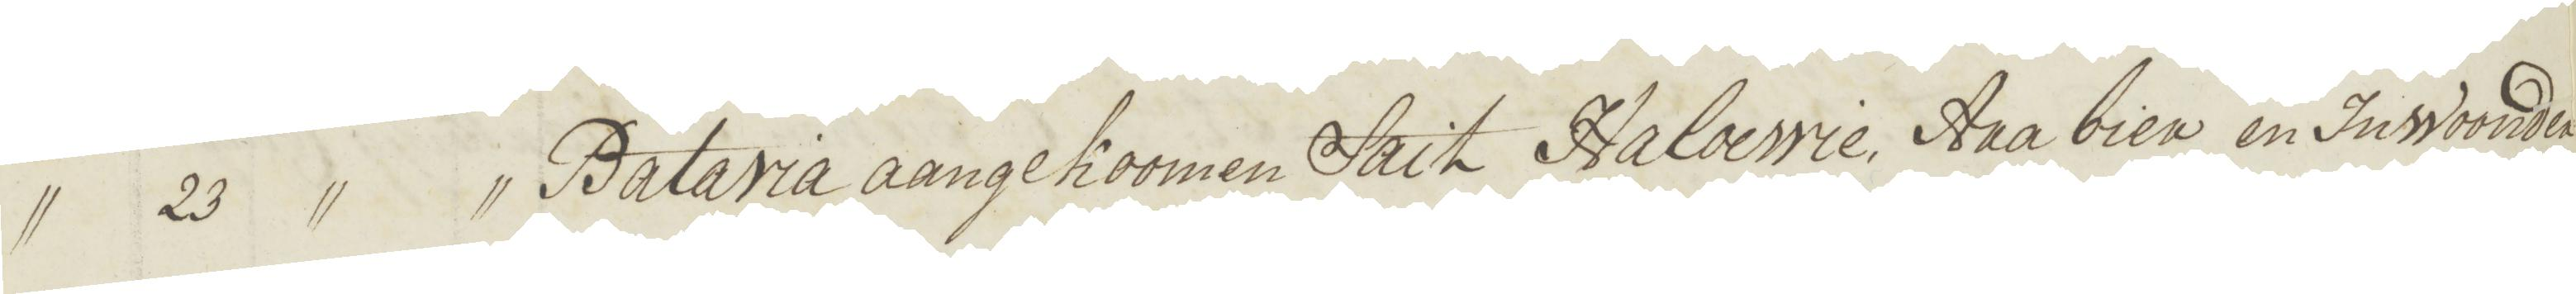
„ 23 „ „ Batavia aangekoomen Sait Haloewie, Arabier en Inwoonder
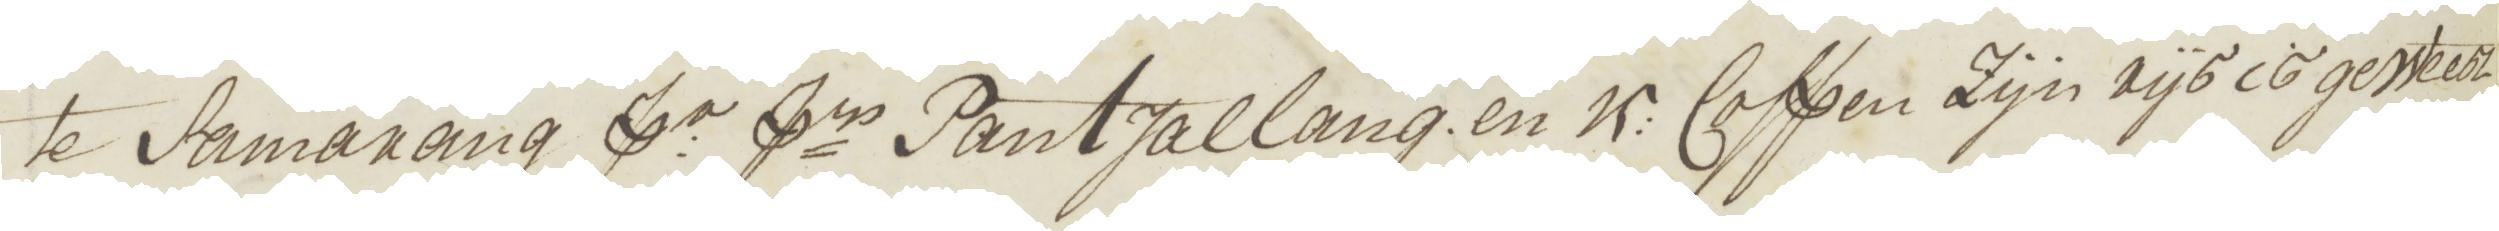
te Samarang p:r p=w Pantjallang. en 15: Coppen Zijn rijs is geweest
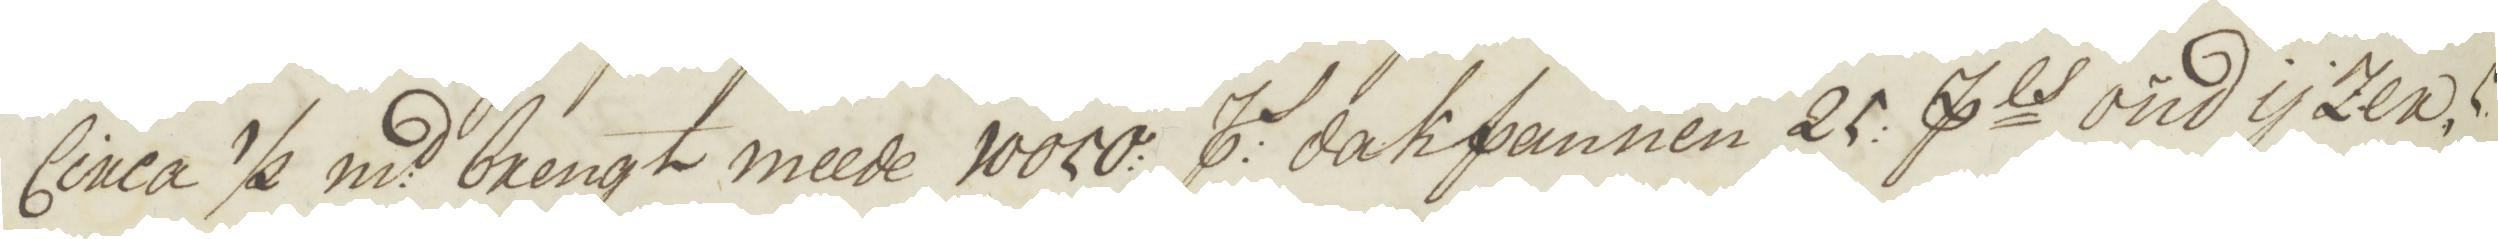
Circa ½ m:d brengt meede 10050: p:s dakpannen 25: p=ls oud ijzer, 5.
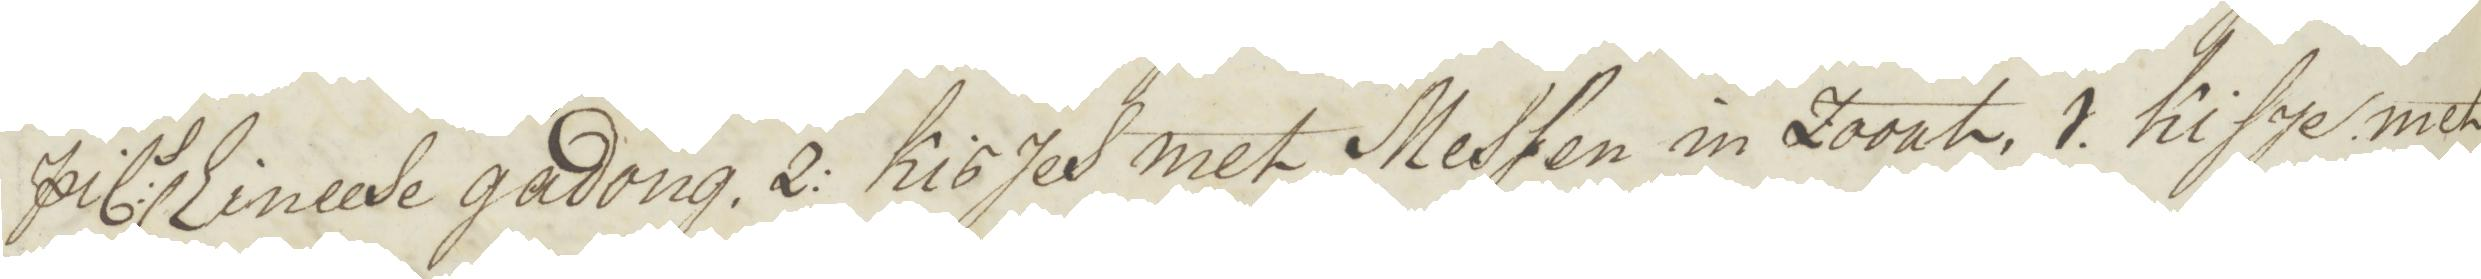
pic:s Chineese gadong. 2: kisjes met Messen in Zoort, 1. kisje met
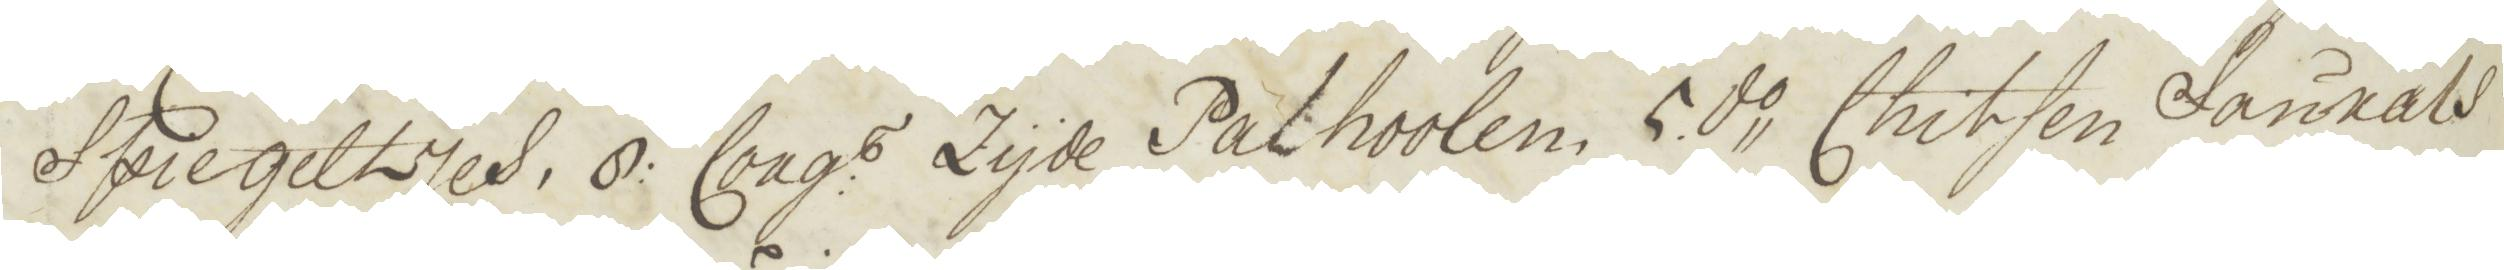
Spiegeltsjes, 8: Corg:s Zijde Pathoolen 5. d„o Chitsen Saurats
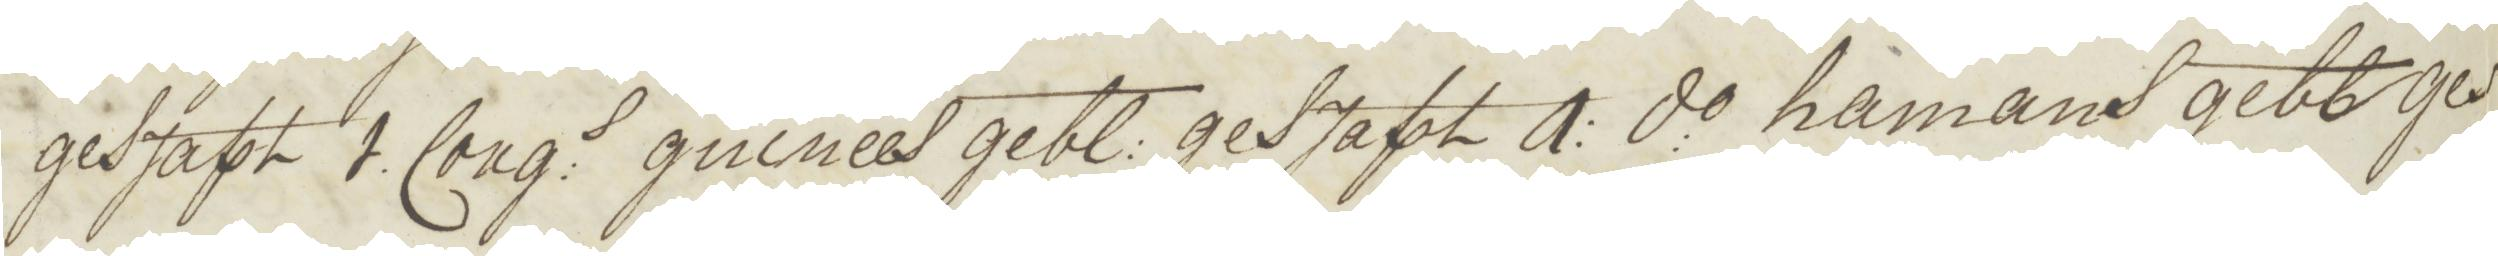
gesjapt 1. Corg:s guinees gebl: gesjapt 4: d:o hamans gebl ges
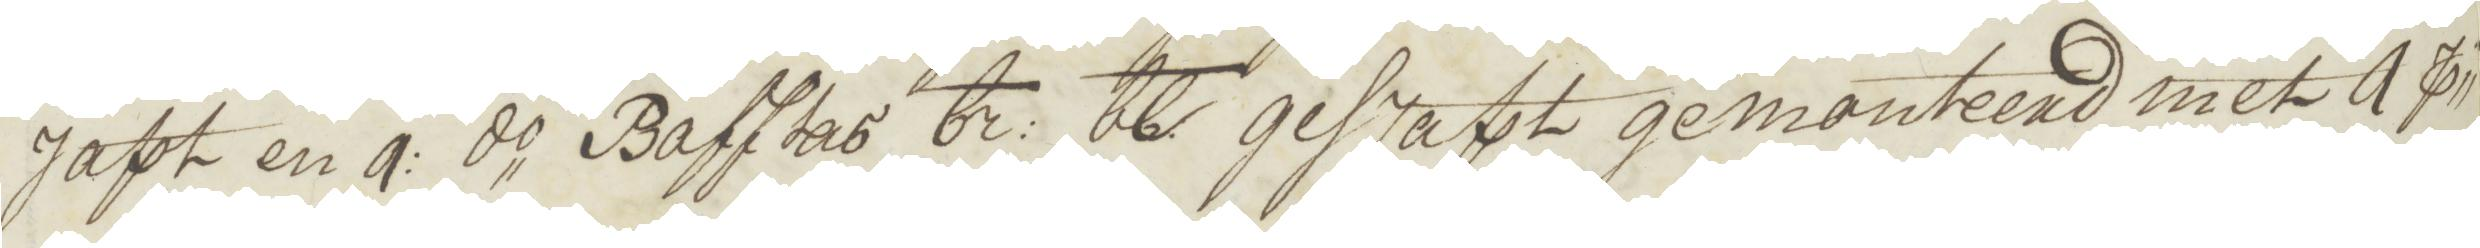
japt en 4: d„o Bafftas br: bl: gesjapt gemonteerd met 4 p„s
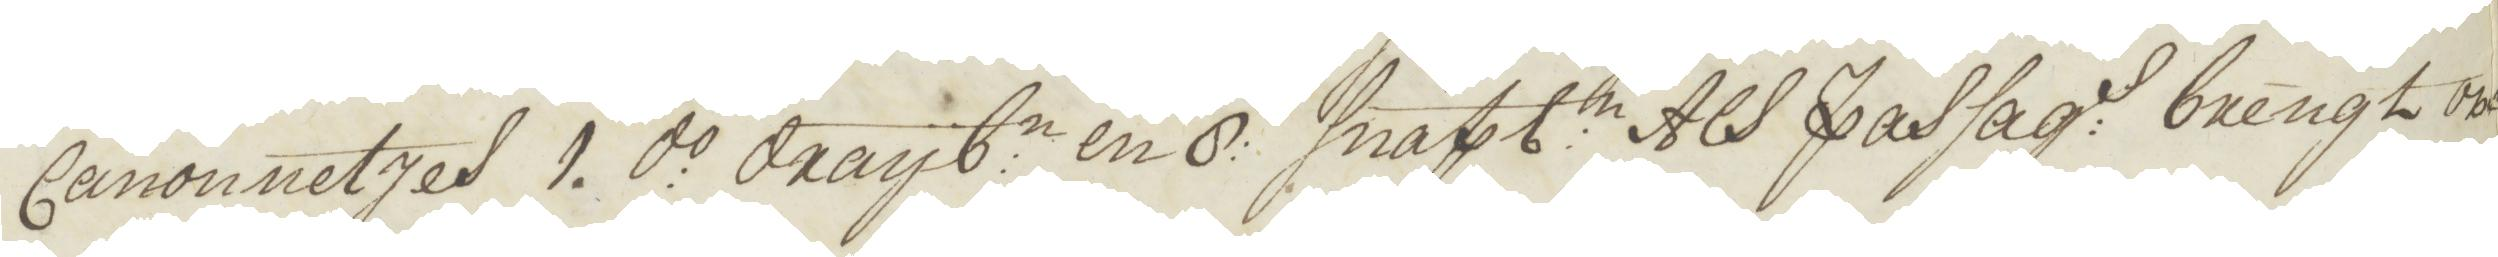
Canonnetjes 1. d:o draijb:n en 8: snaph:n Als passag:s brengt ov
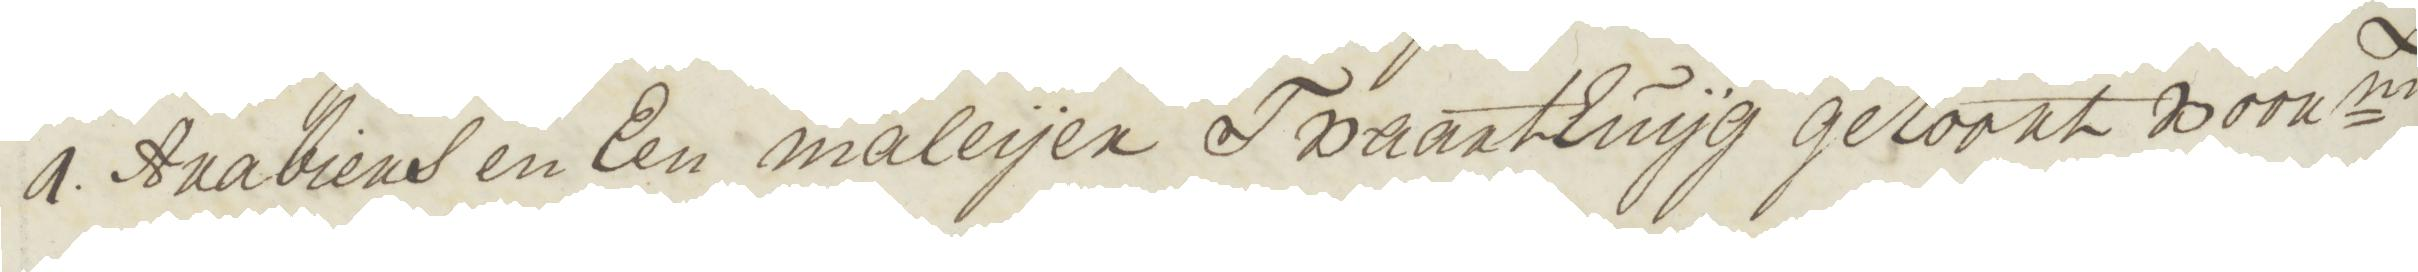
4. Arabiers en Een maleijer T vaarthuijg gehoort voor=m
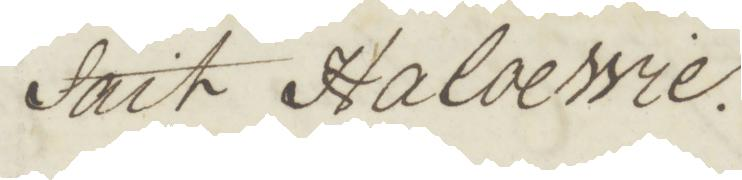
Sait Haloewie.
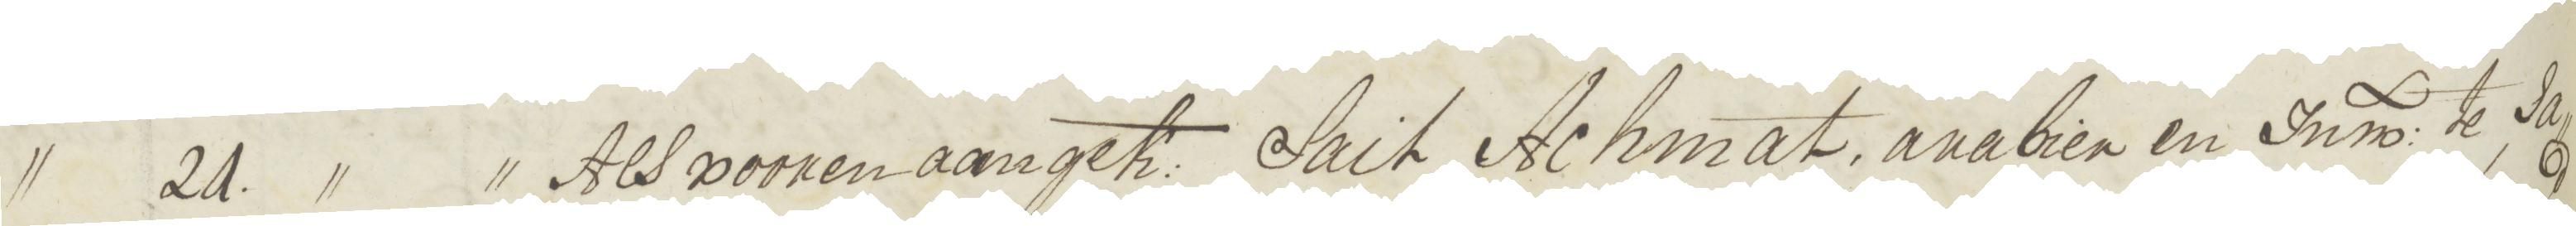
„ 24. „ „ Als vooren aangek: Sait Achmat, arabier en Inw: te Sa„
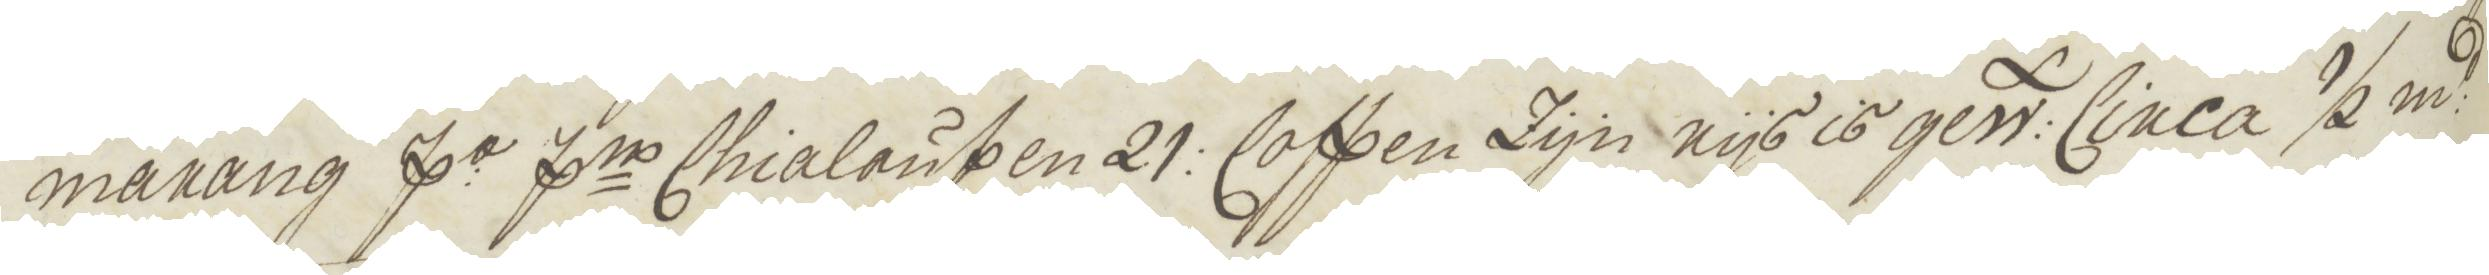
marang p:r p=w Chialoup en 21: Coppen Zijn rijs is gew: Circa ½ m:d
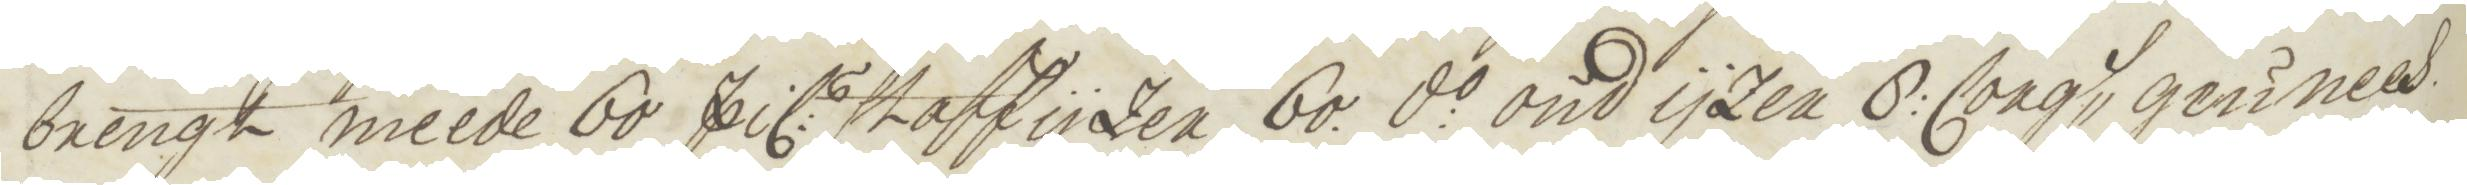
brengt meede 60 pic:s staff ijzer 60. d:o oud ijzer 8: Corg„s guinees.
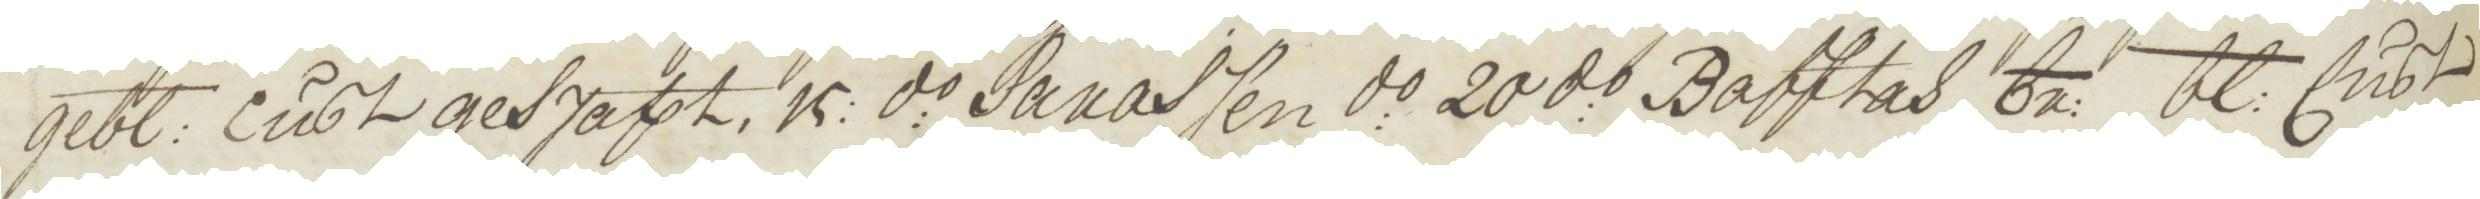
gebl: cust gesjapt, 15: d:o Sarassen d:o 20 d:o Bafftas br: bl: Cust
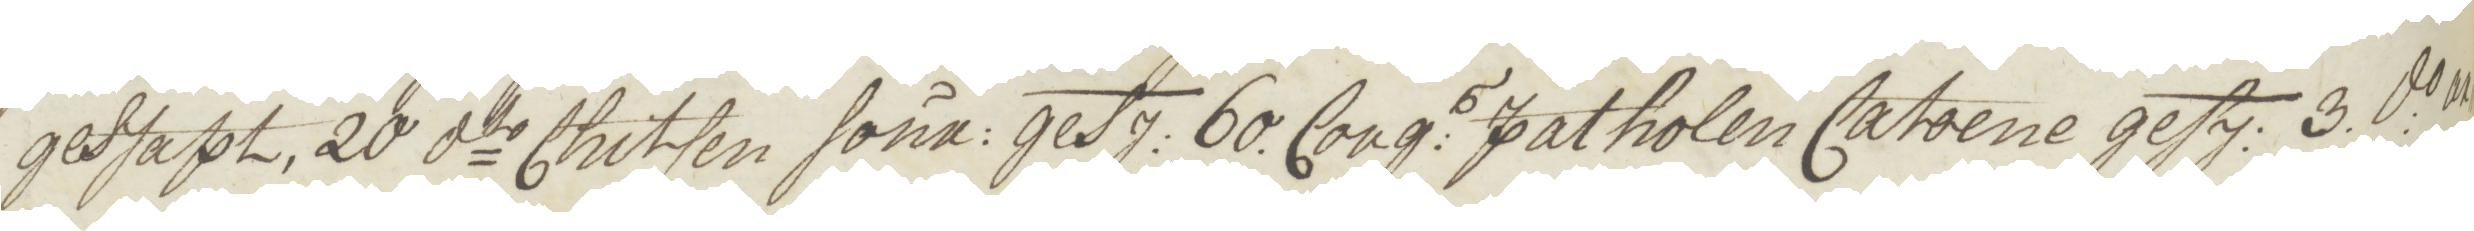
gesjapt, 20 d=to Chitsen sour: gesj: 60. Corg:s patholen Catoene gesj: 3. d:o ar
